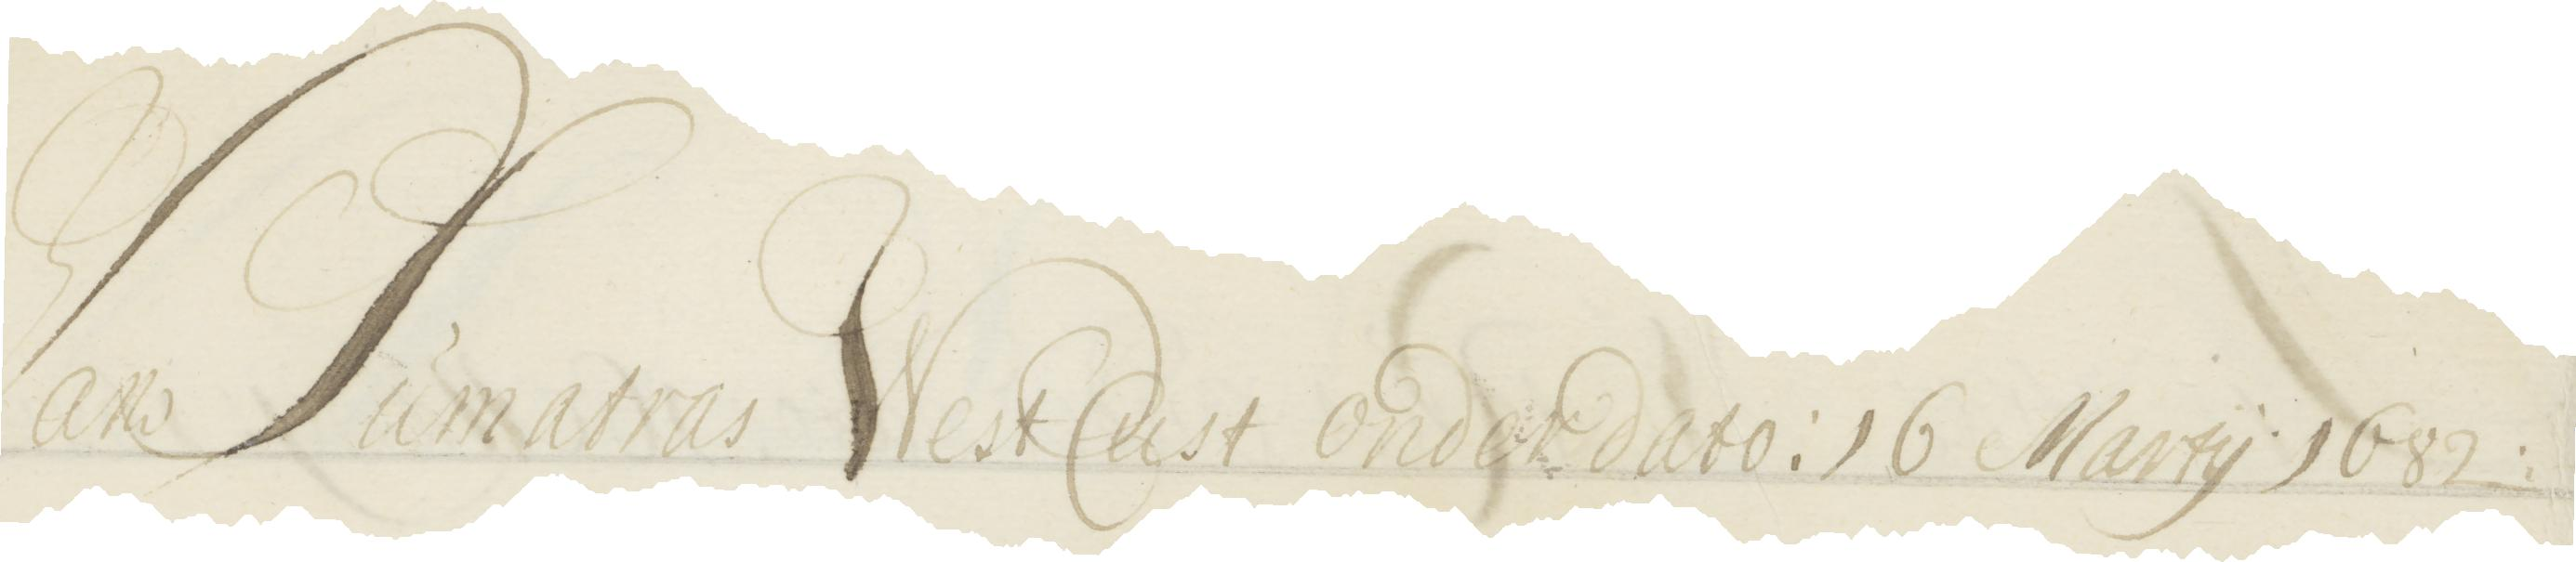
Van Sumatras West Cust onder dato: 61 Martij 1682:
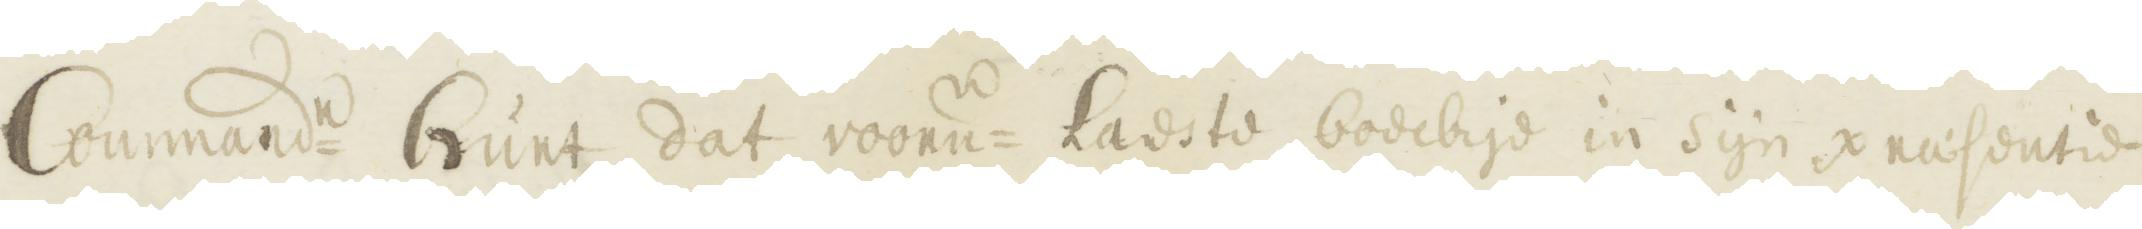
Command:r Hurt dat voorn= laeste boeckje in sijn praesentie
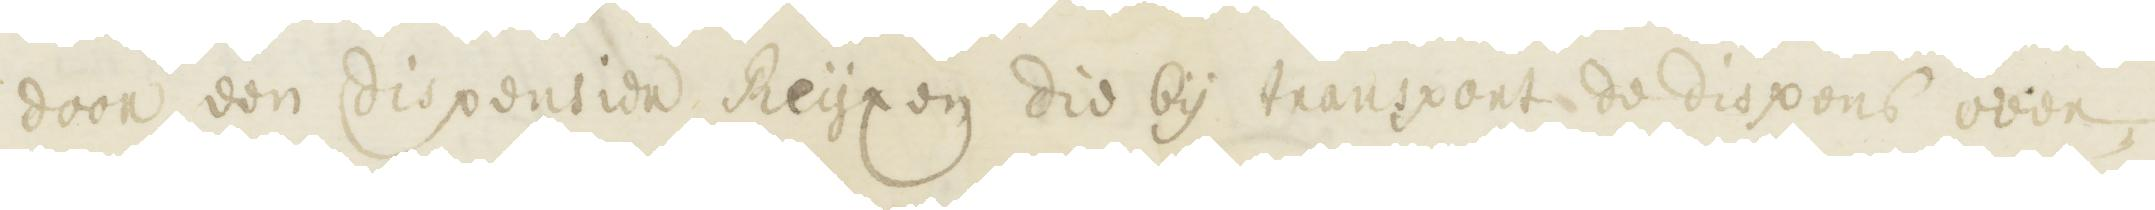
door een dispensier Reijxen die bij transport de dispens over„
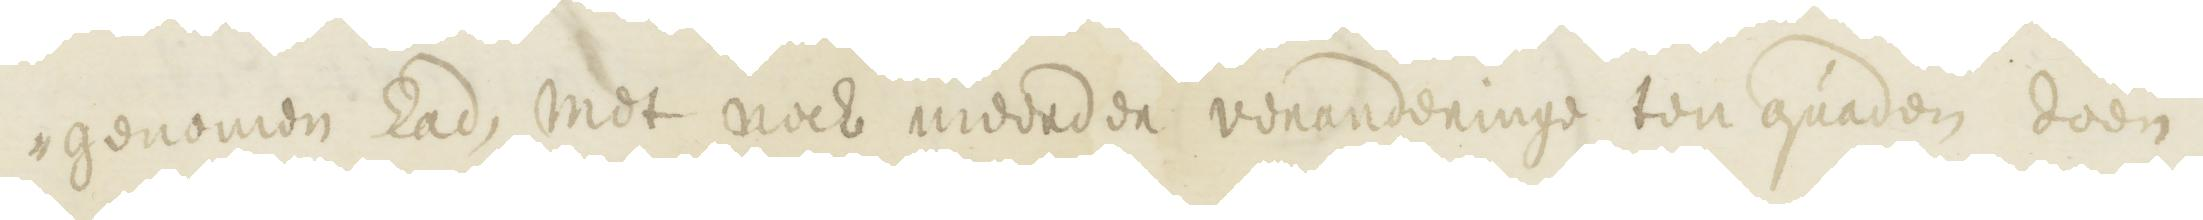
„genomen had, met noch meerder veranderinge ten quaden doen
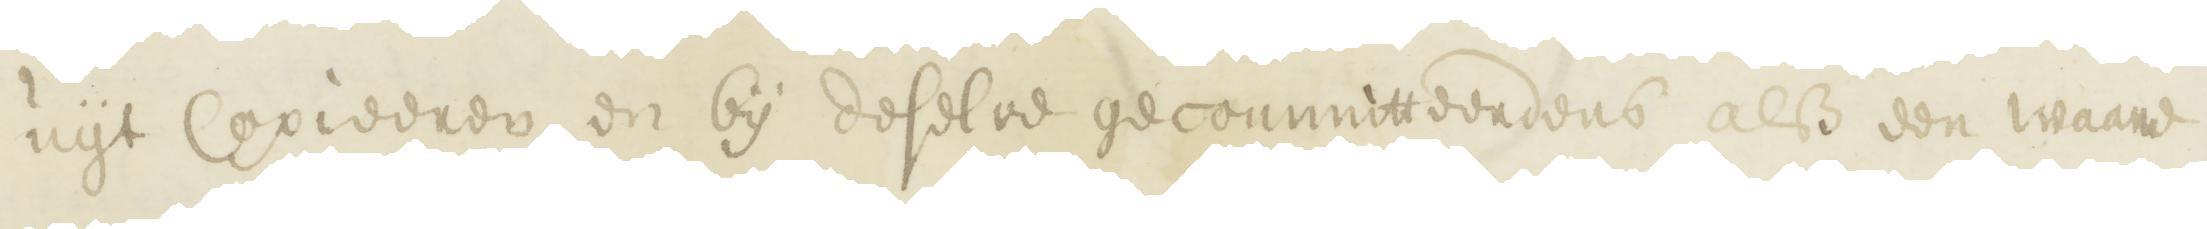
uijt Copieeren en bij deselve gecommitteerdens alse een waare
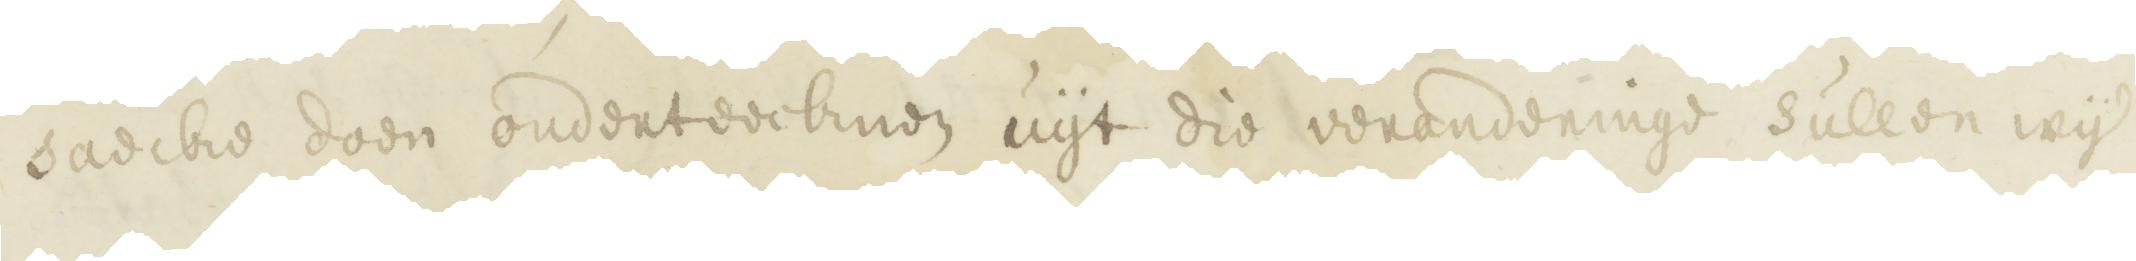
saecke doen onderteecknen uijt die veranderinge sullen wij
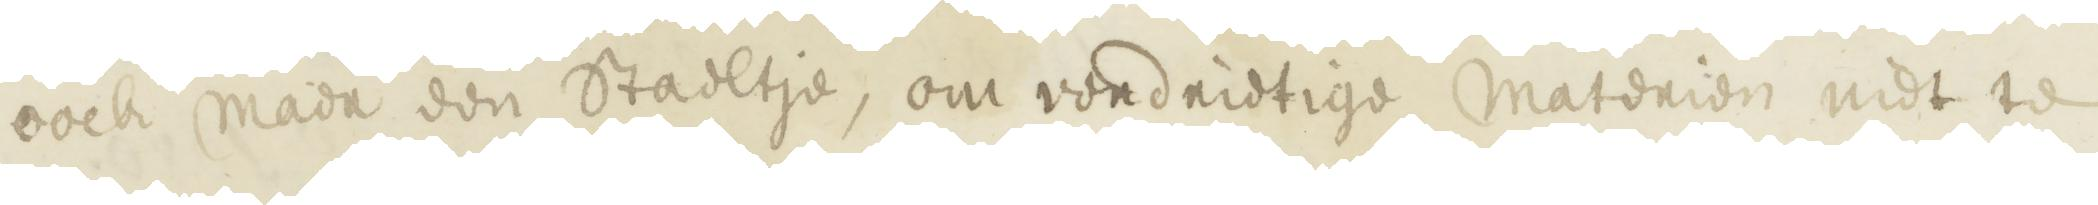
oock maer een staeltje, om verdrietige materien niet te
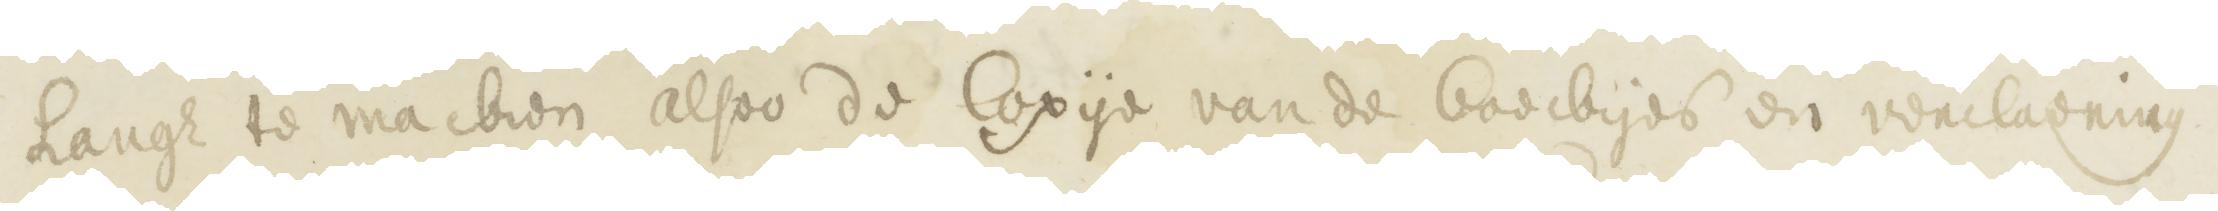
langh te macken alsoo de Copije van de boeckjes en verclaering
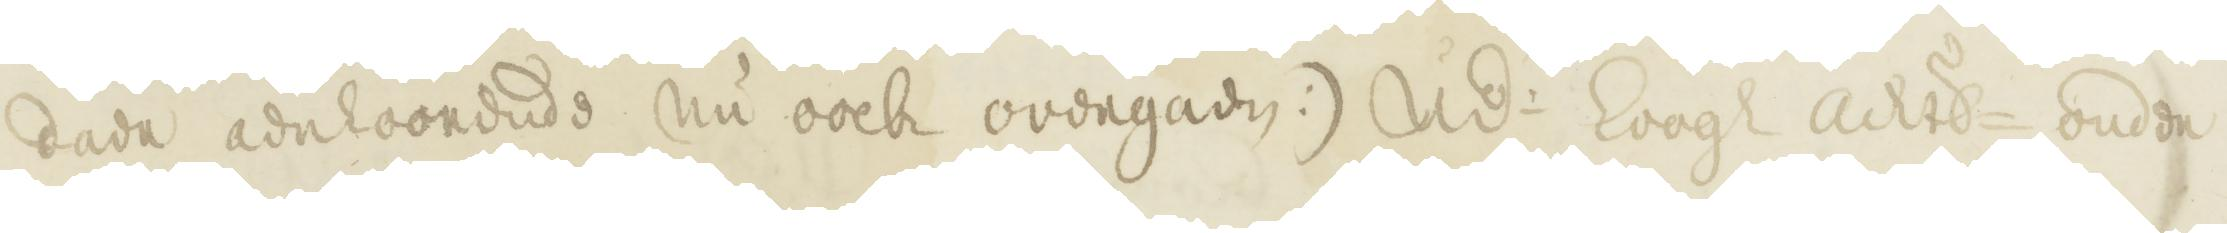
daer aenhoorende nu oock overgaen :) UE: hoogh Achtb= onder
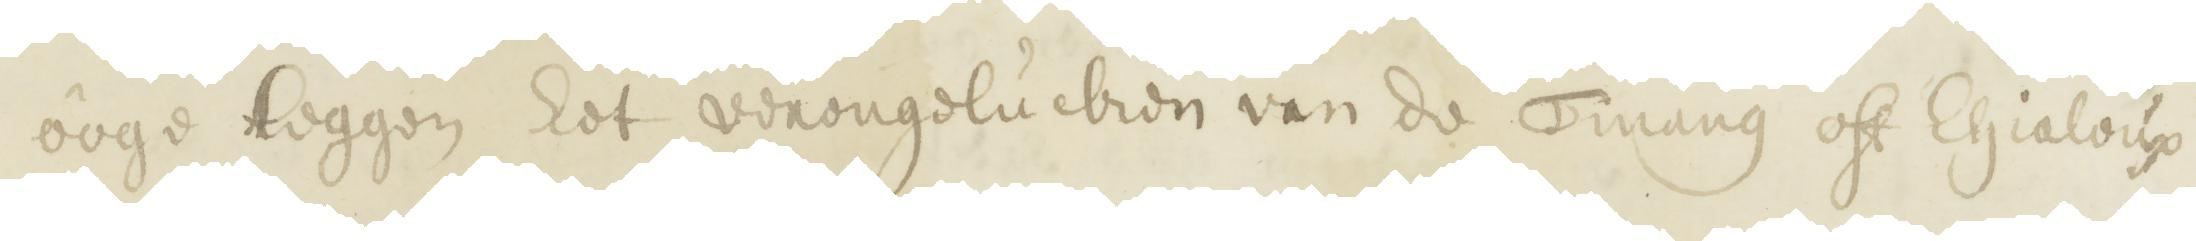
ooge leggen het verongelucken van de Tinang oft chialoup
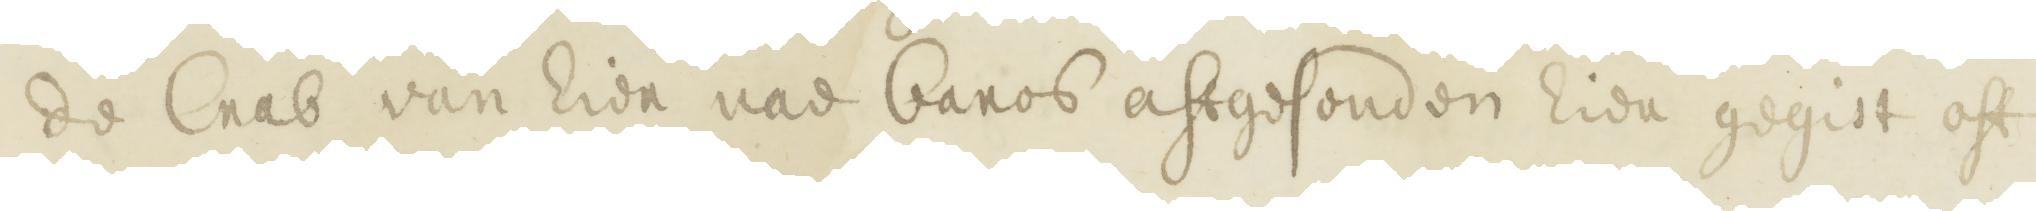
de Crab van hier nae baros affgesond en hier gegist oft
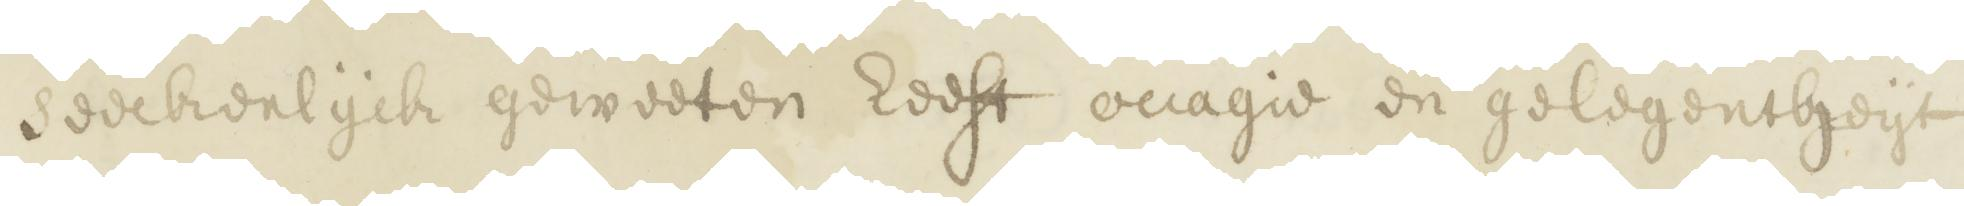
seeckerlijck geweeten heeft occagie en gelegentheijt
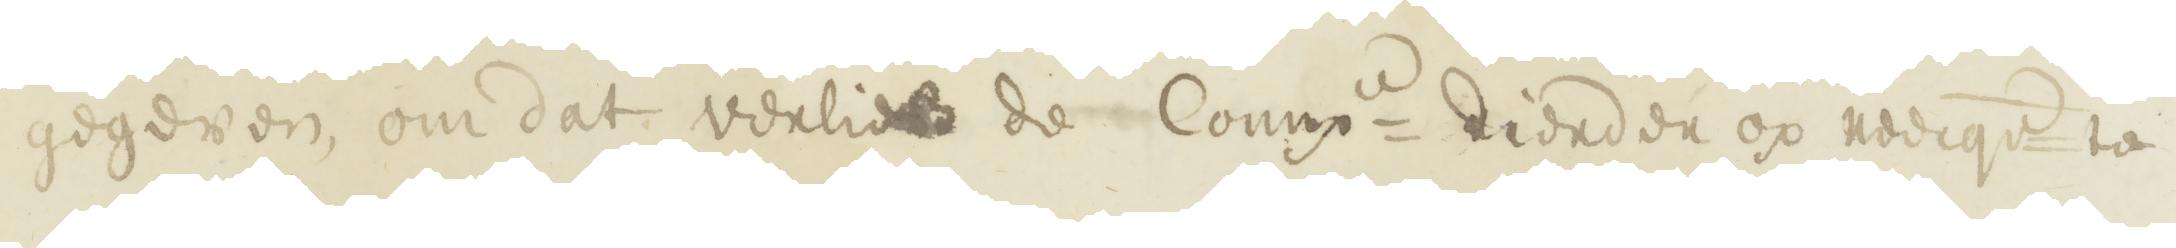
gegeven om dat verlies de Comp=e dier der op reecqe te
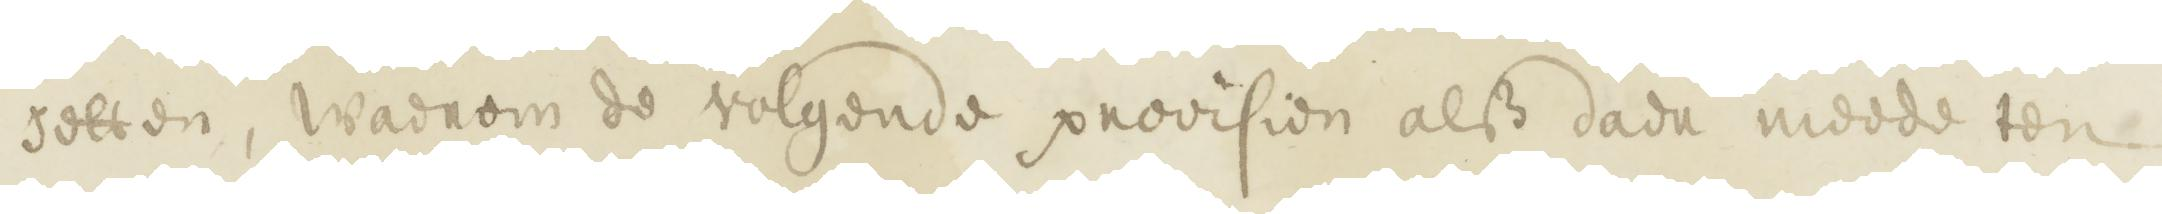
setten, waerom de volgende provisien alse daer meede ten
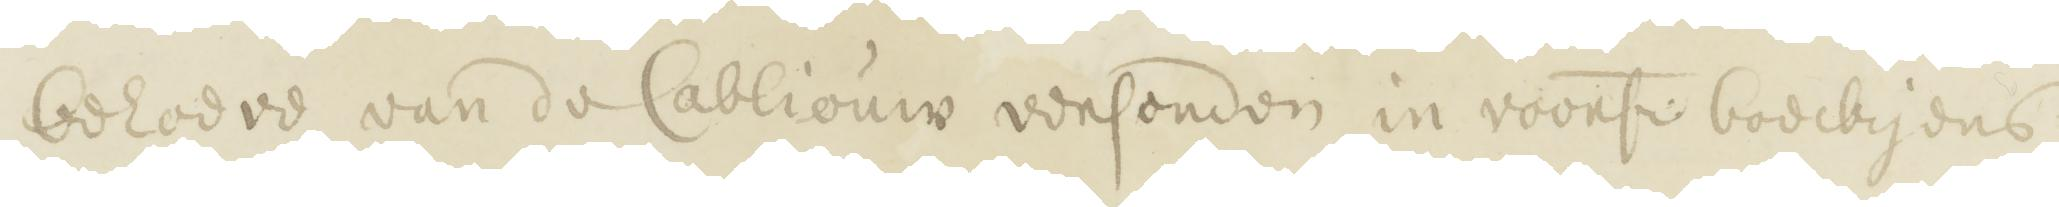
behoeve van de Cabliouw versonden in voorsz: boeckjens
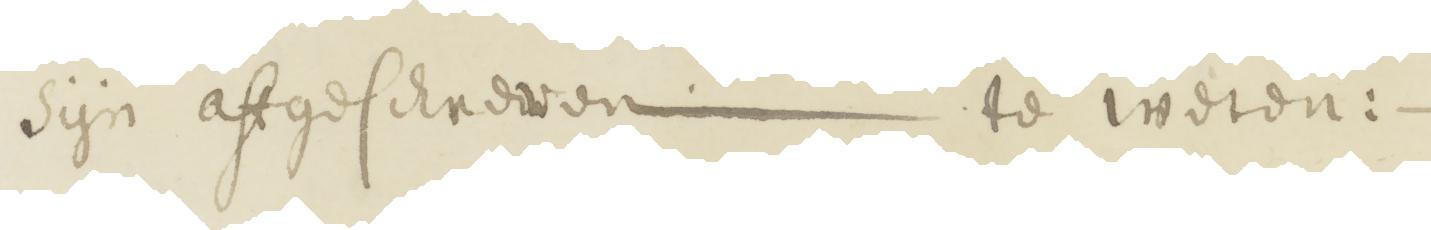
sijn affgeschreven te weten:
